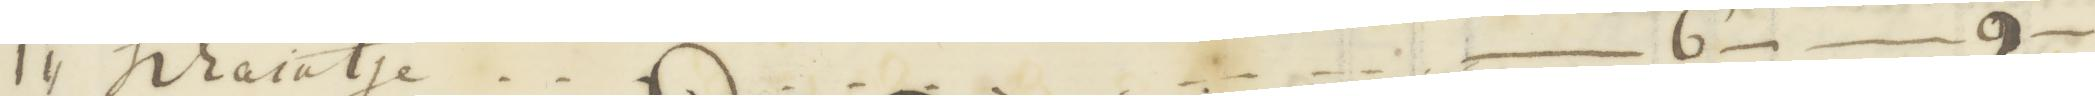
1 „ schairtje - - - . - - - . - - - - . — 6 — — 9 —
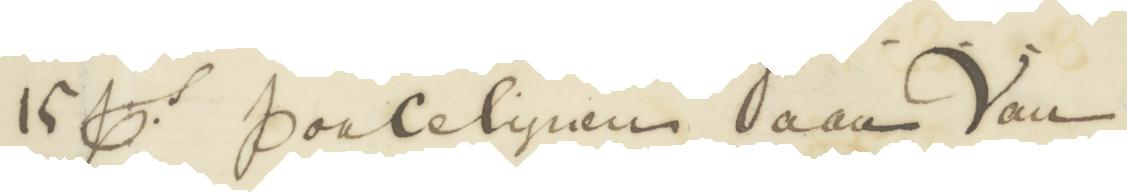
15 p.s porcelynen daar van
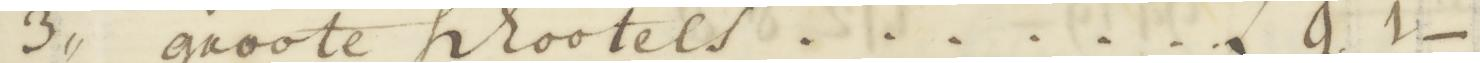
3 „ groote schootels . . . . . . ƒ4. 1: —
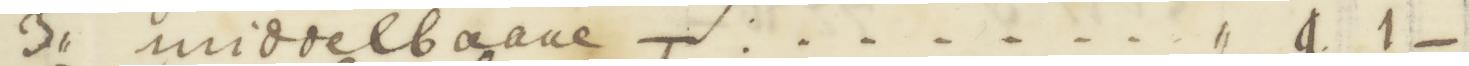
3 „ middelbaare _:o - - - - - - - „ 4. 1 —
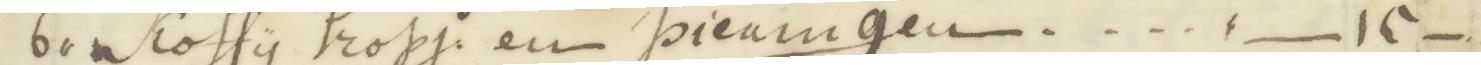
6 „ Koffij kopj:s en pieringen - - - - „ — 15 —.
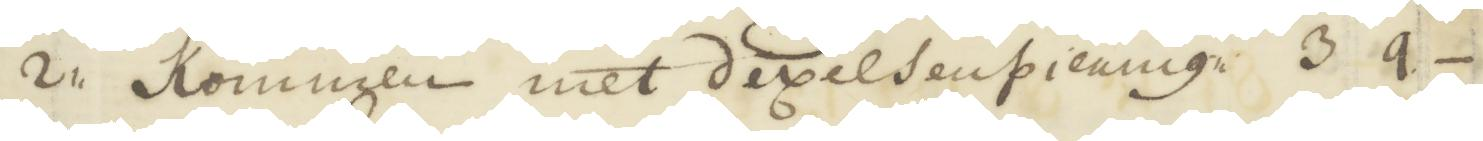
2 „ kommen met dexels en piering „ 3 4. —
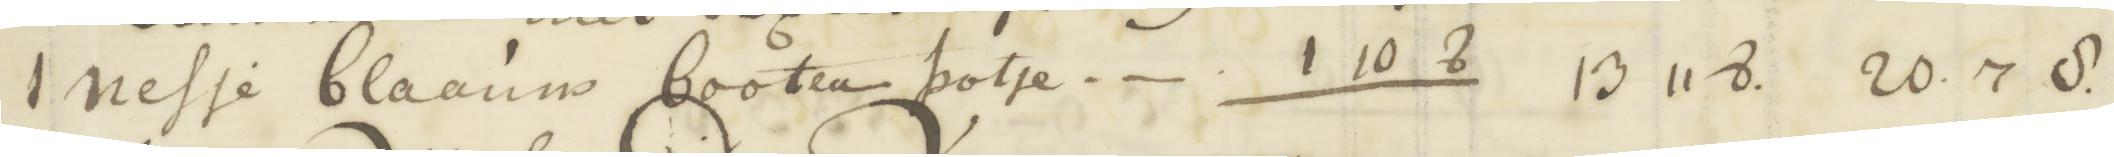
1 nesje blaauw booten potje . — . 1 10 8 13 11 8. 20. 7 8.
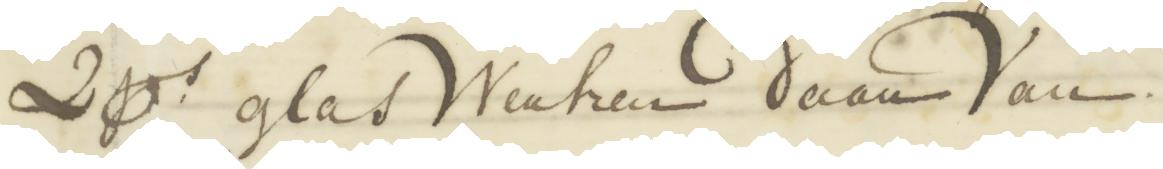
2 p.s glas Werken daar Van
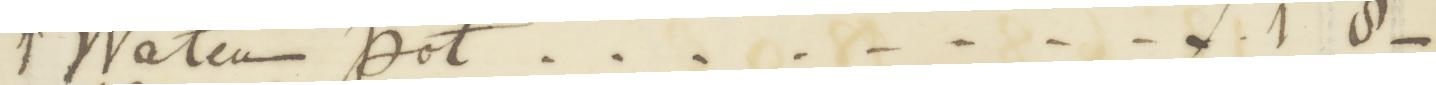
1 Water pot . . . . - - - - ƒ. 1 8 —
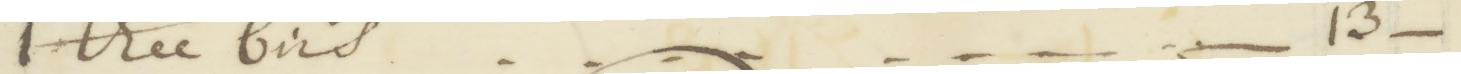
1 thee bus - - - - - - - - - —13 —
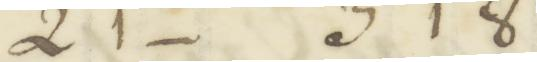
21 — 3 18
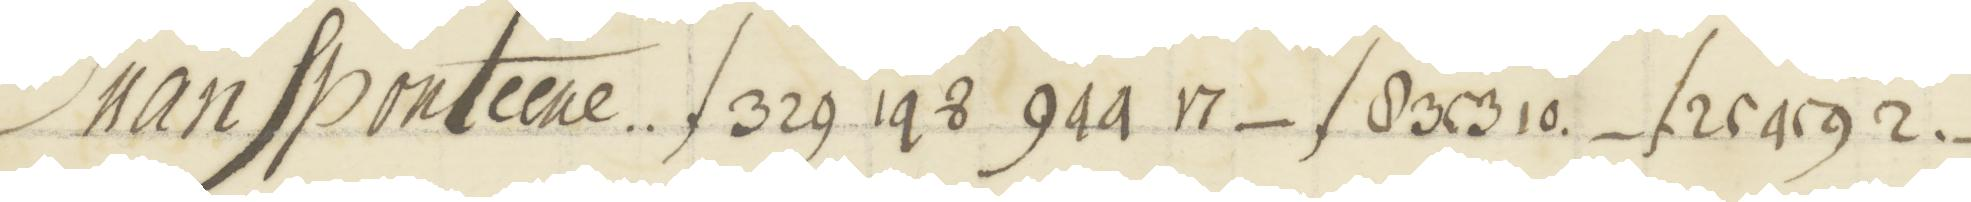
Transporteere . . ƒ329 148 944 17 — ƒ 835310. — ƒ254592.
